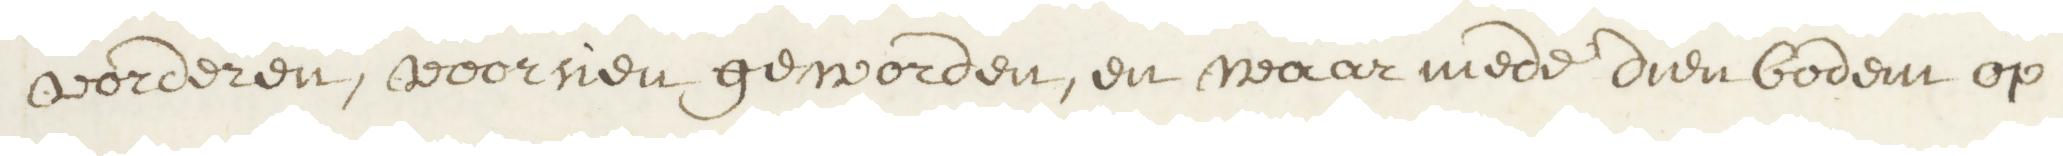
vorderen, voorsien geworden, en waar mede dien bodem op
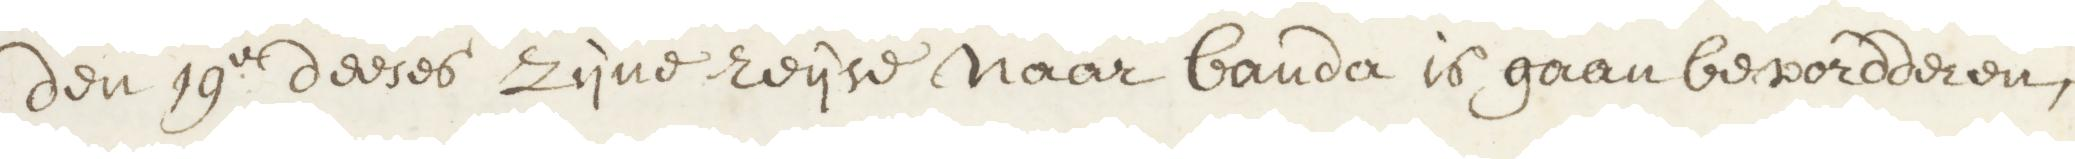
den 19:e deeses zijne reijse naar banda is gaan bevordderen,
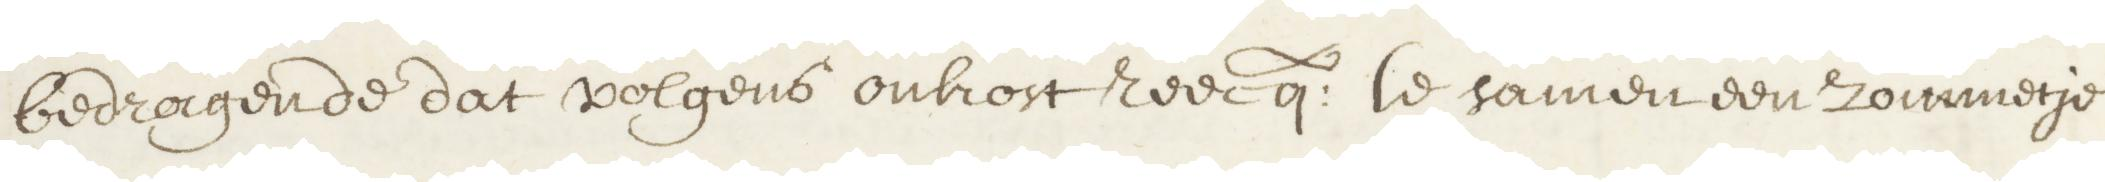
bedragende dat volgens onkost reecq: te samen een zommetje
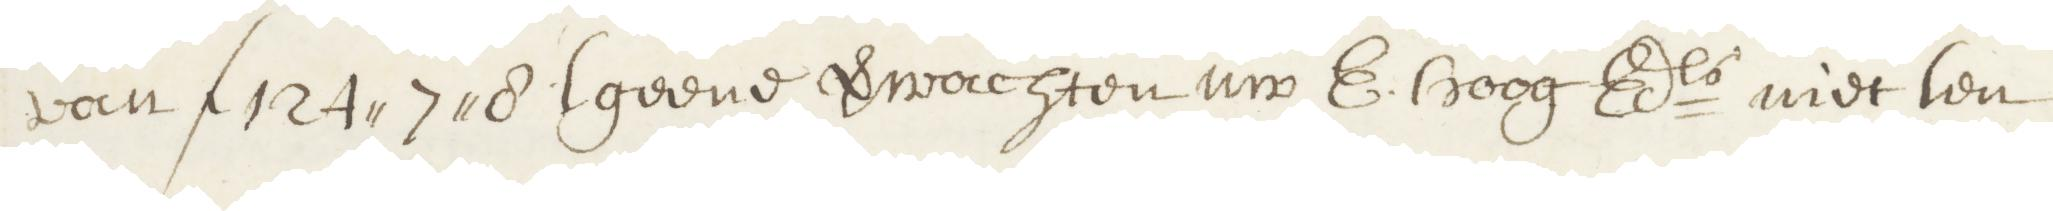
van ƒ124„7„8 tgeene verwachten uw E. Hoog Ed=ls niet ten
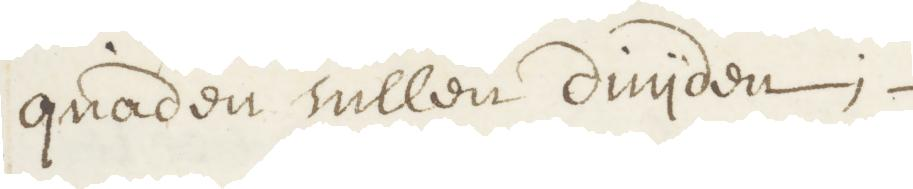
quaden sullen duijden;-
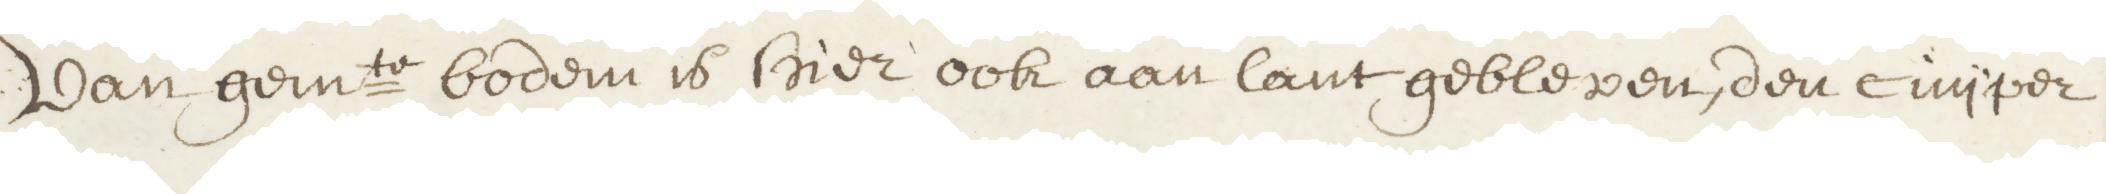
Van gem=te bodem is hier ook aan lant gebleven, den cuijper
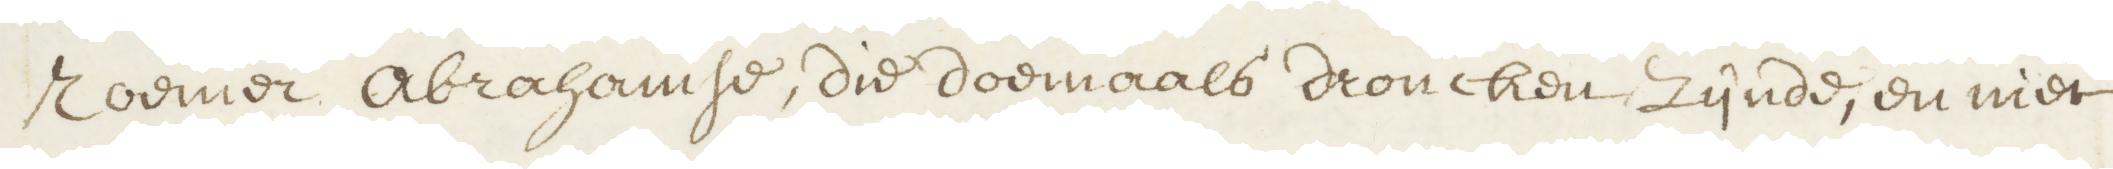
roemer Abrahamse, die doemaals droncken zijnde, en niet
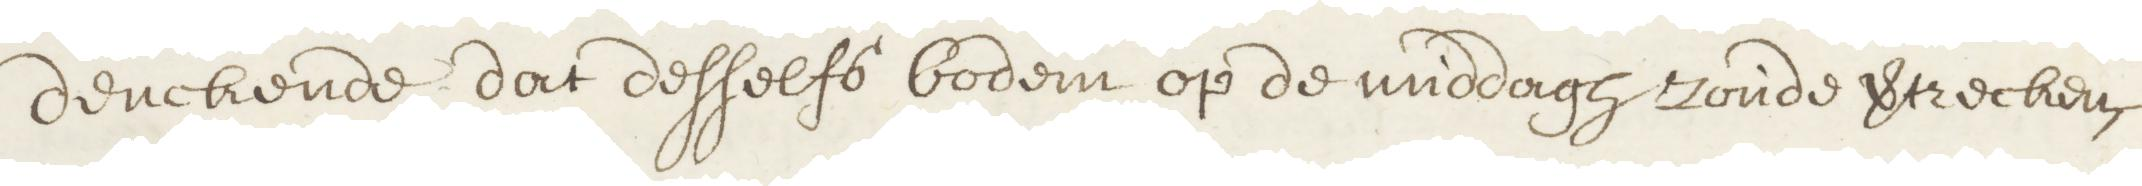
denckende dat desselfs bodem op de middagh zoude vertrecken,
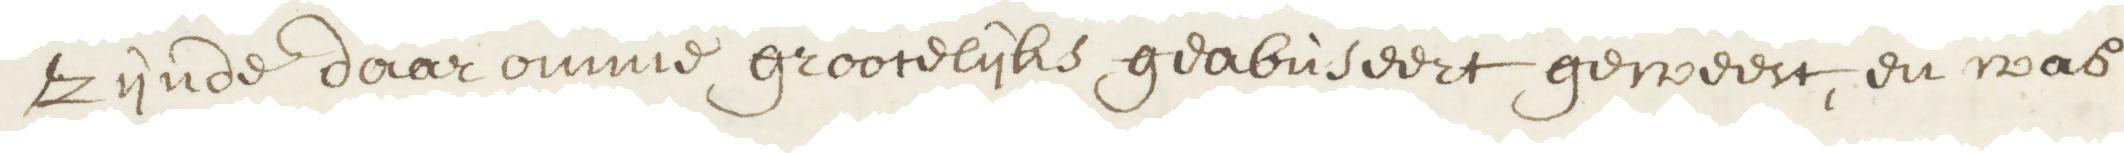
zijnde daar omme grootelijks geabuseert geweert, en was
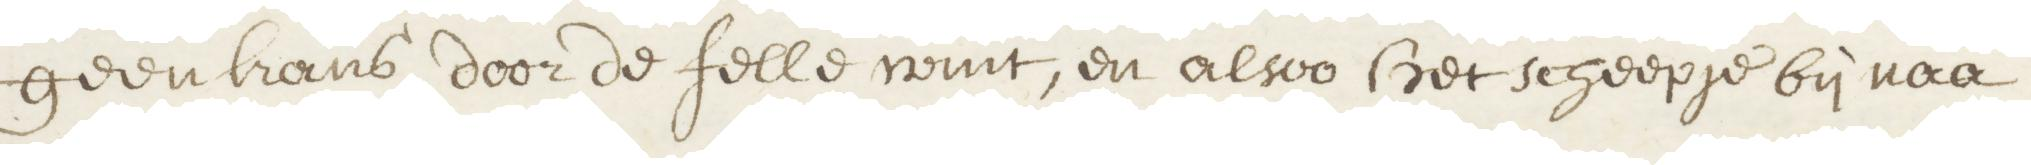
geen kans door de felle wint, en alsoo het scheepje bij naa
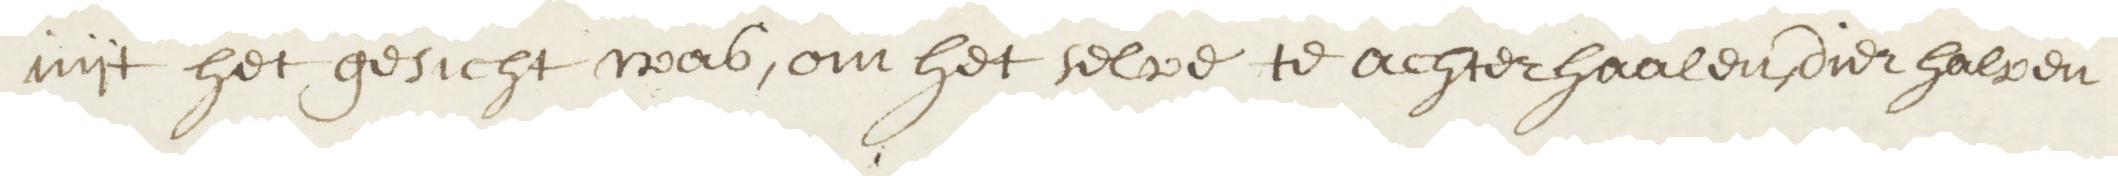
uijt het gesicht was, om het selve te achterhaalen, dier halven
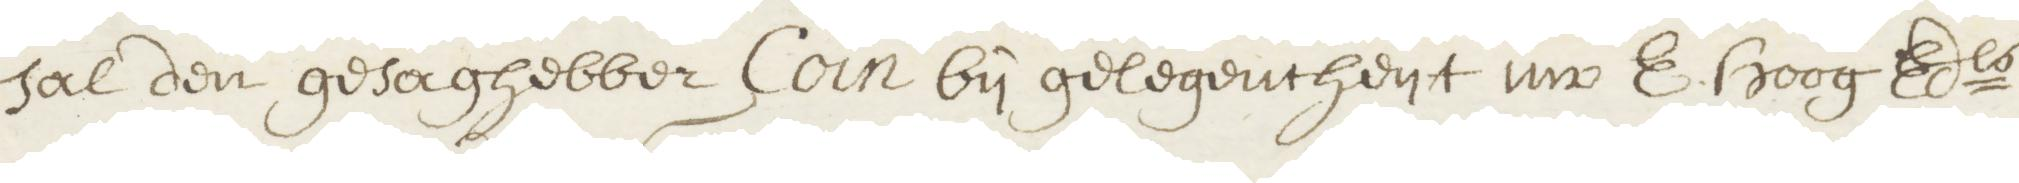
sal den gesaghebber Coin bij gelegentheyt uw E. Hoog Ed=ls
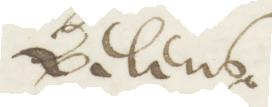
pelens
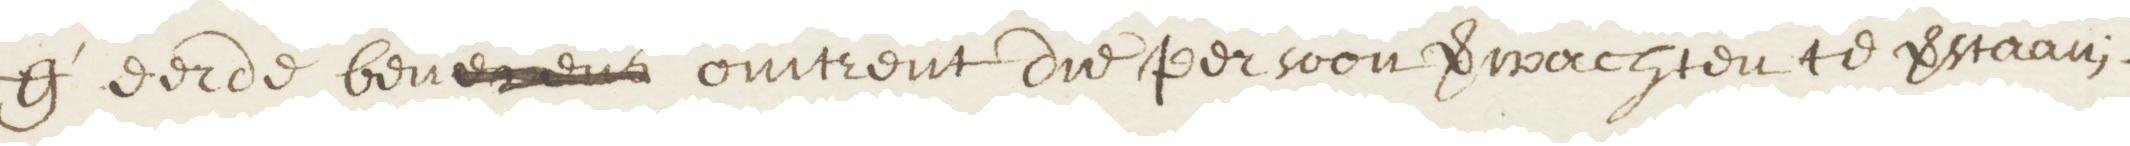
g’eerde ben omtrent die persoon verwachten te verstaan;
